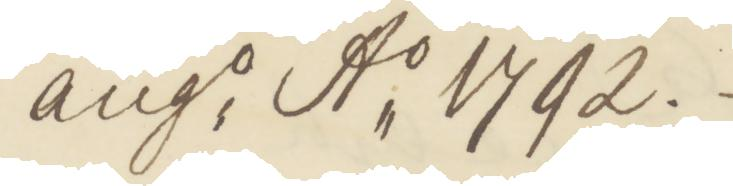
aug„o A„o 1742. _
